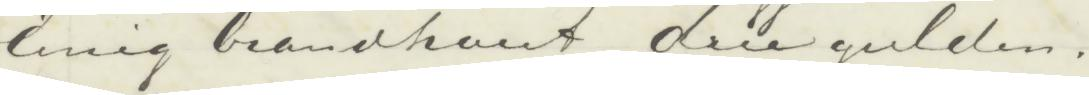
Eenig brandhout, drie gulden.
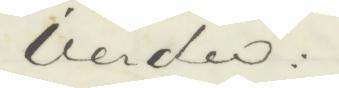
Verder:
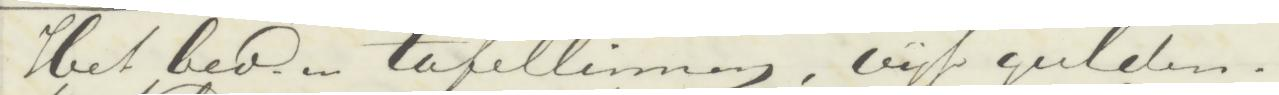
Het bed- en tafellinnen, vijf gulden.
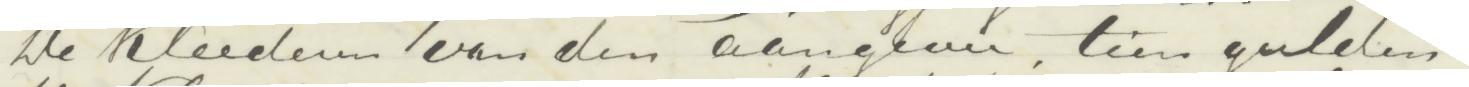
De Kleederen van den aangever, tien gulden
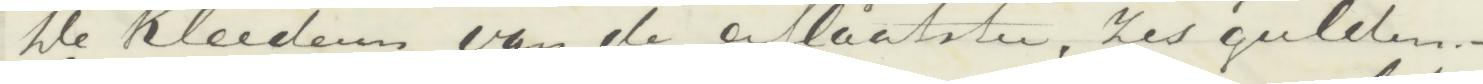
De Kleederen van de erflaatster, zes gulden.
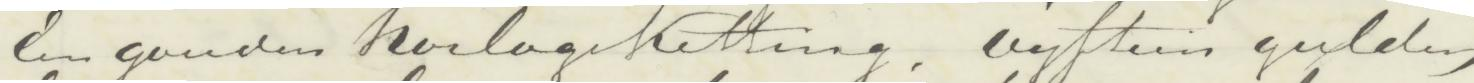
Een gouden horlogeketting, vyftien gulden
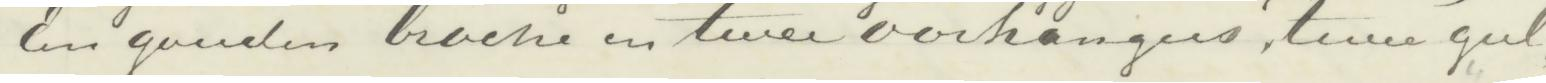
Een gouden broche en twee oorhangers, twee gul
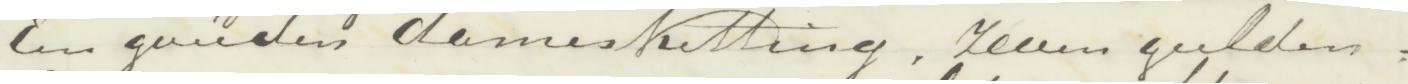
Een gouden damesketting, zeven gulden
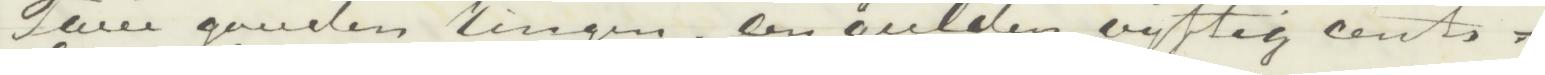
Twee gouden ringen, een gulden vyftig cents .-
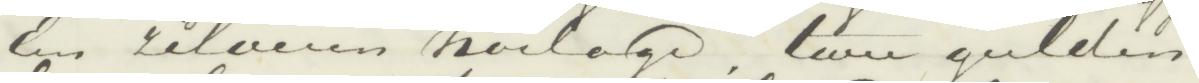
Een zilveren horloge, twee gulden
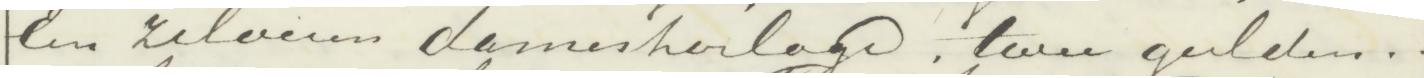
Een zilveren dameshorloge, twee gulden.
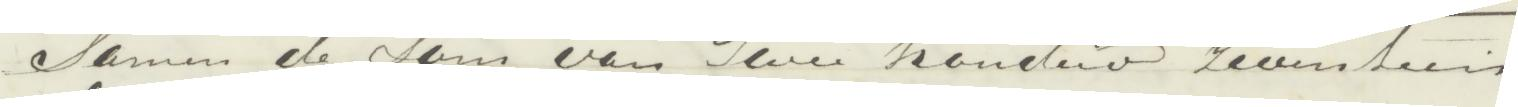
samen de som van Twee honderd zeventien
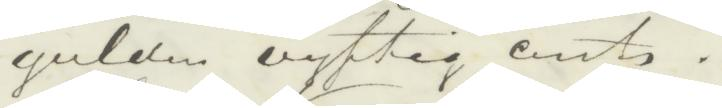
gulden vyftig cents .
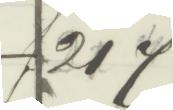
ƒ217
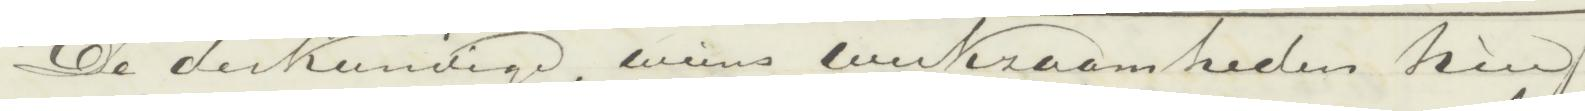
De deskundige, wiens werkzaamheden hier
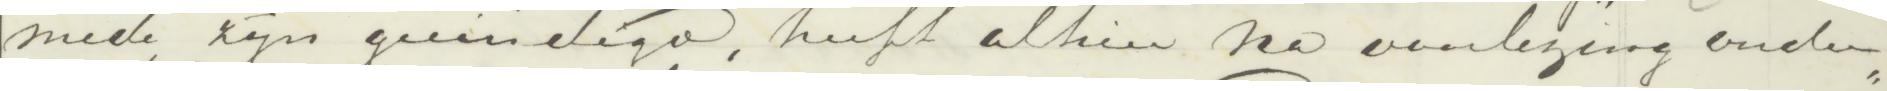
mede zijn geeindigd, heeft alhier na voorlezing onder„
